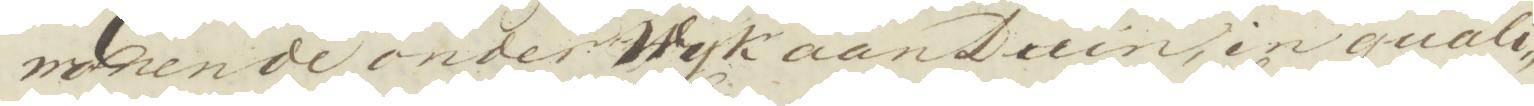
wonende onder Wyk aan Duin, in quali
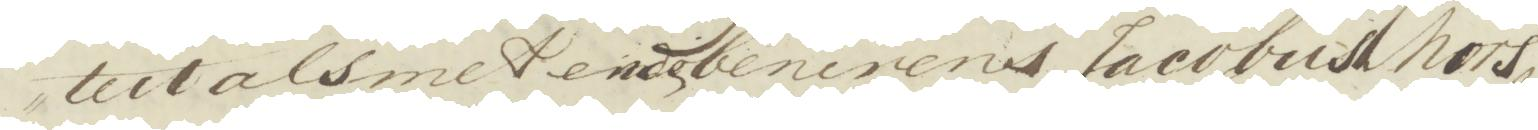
„teit als met ende benevens Jacobus Mors,
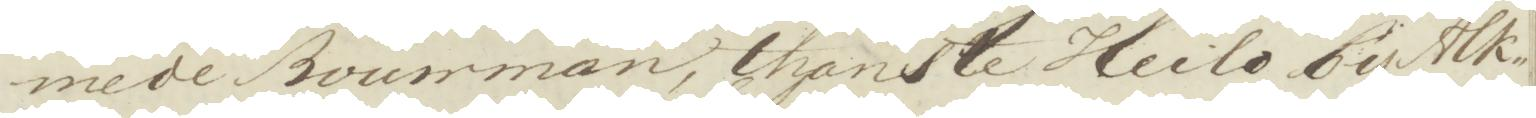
mede Bouwman, thans te Heilo bij Alk„
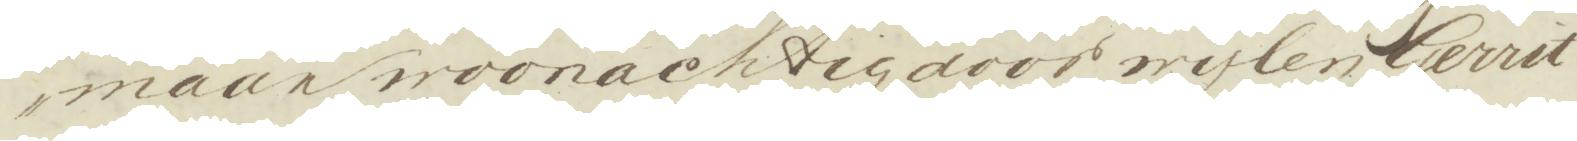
„maar woonachtig door wylen Gerrit
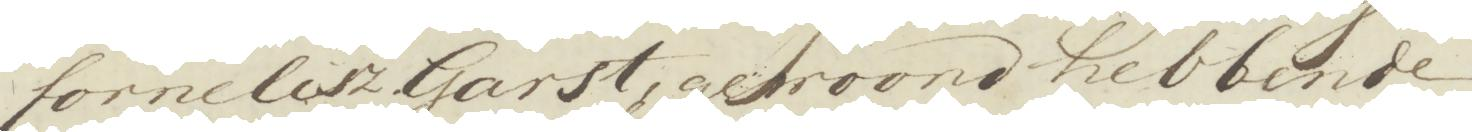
Cornelisz Garst, gewoond hebbende
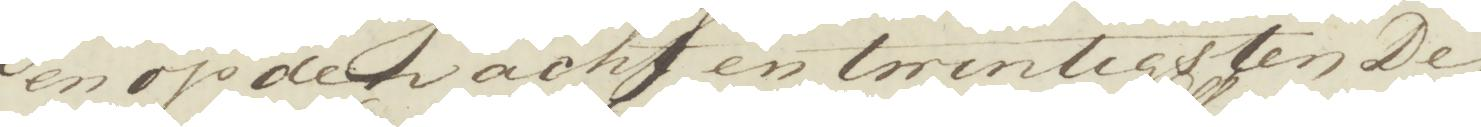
en op den acht en twintigsten De
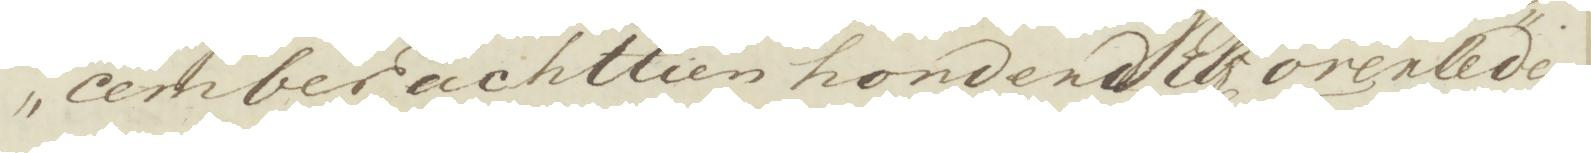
„cember achttien honderd Elf overleden
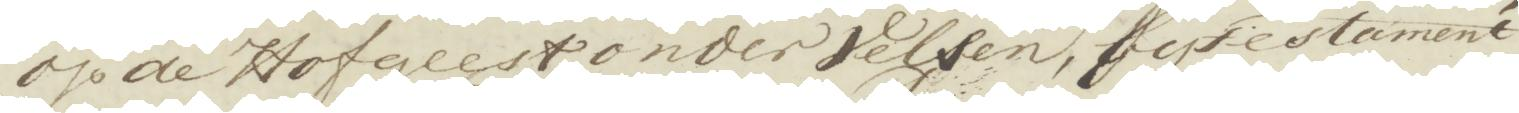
op de Hofgeest onder Velsen, by Testament
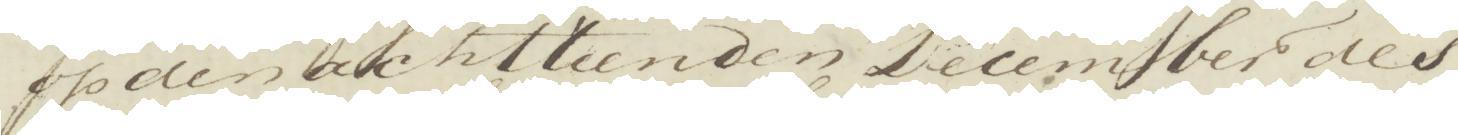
op den achttienden December des
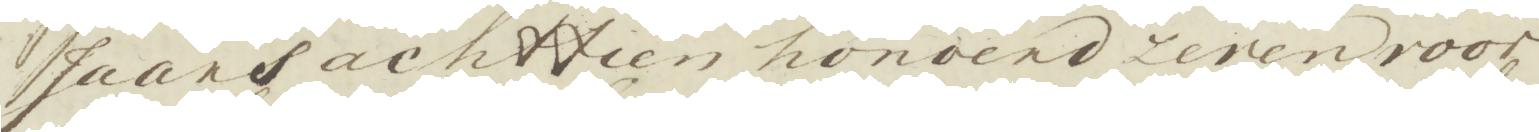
Jaars achttien honderd zeven voor
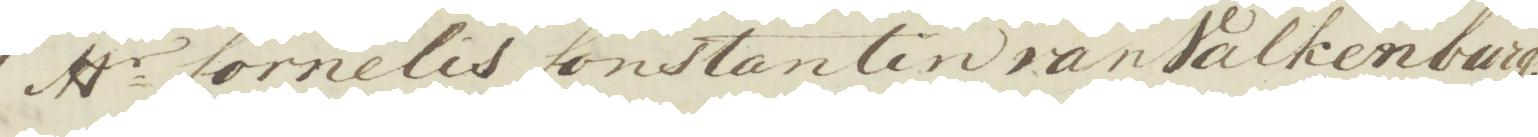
M=r Cornelis Constantin van Valkenburg,
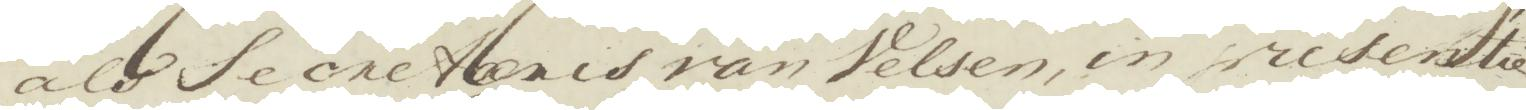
als Secretaris van Velsen, in presentie
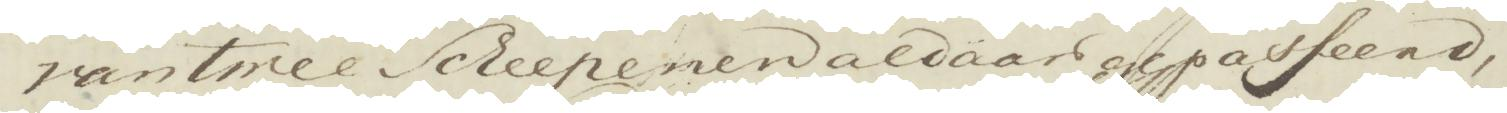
van twee scheepenen aldaar gepasseerd,
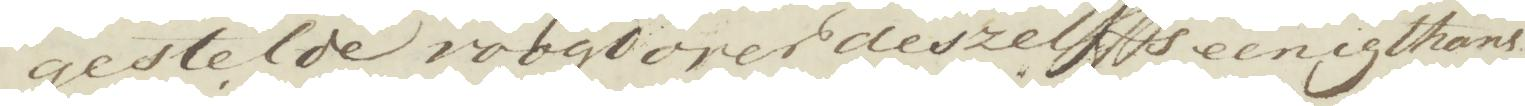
gestelde voogd over deszelfs eenig thans
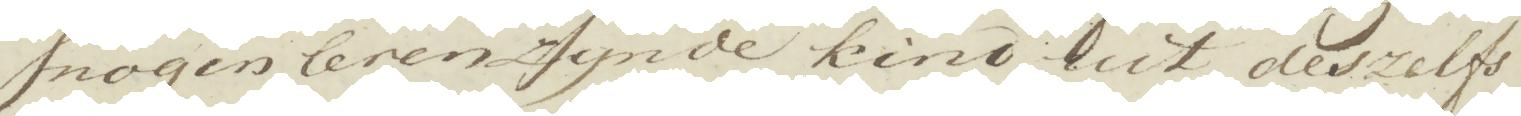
nog in leven zynde kind uit deszelfs
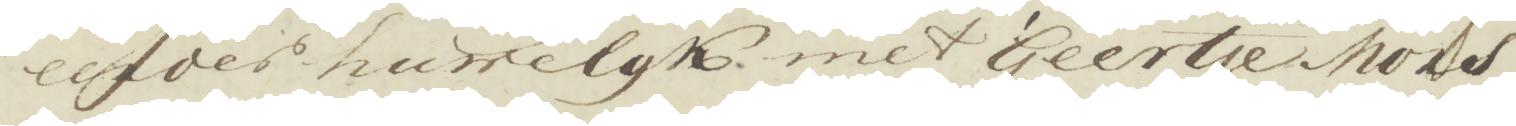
eerder huwelyk met Geertje Mors
